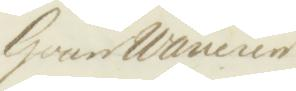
G van Waveren
